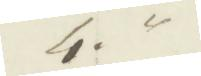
4. „
